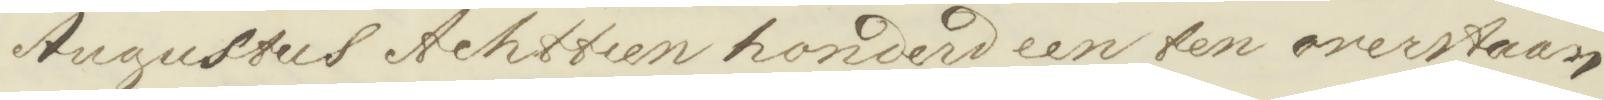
Augustus Achttien honderd een ten overstaan
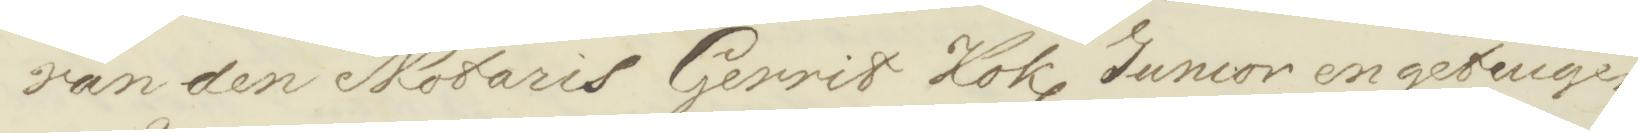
van den Notaris Gerrit Kok Iunior en getuigen
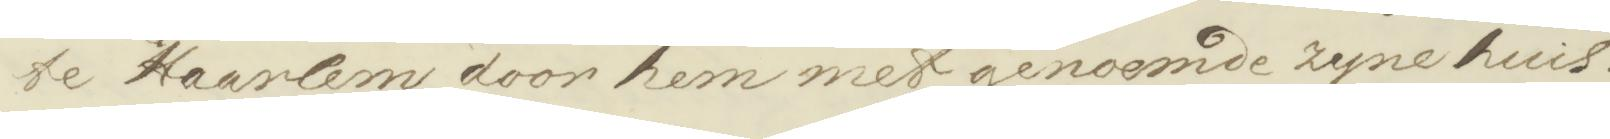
te Haarlem door hem met genoemde zijne huis.
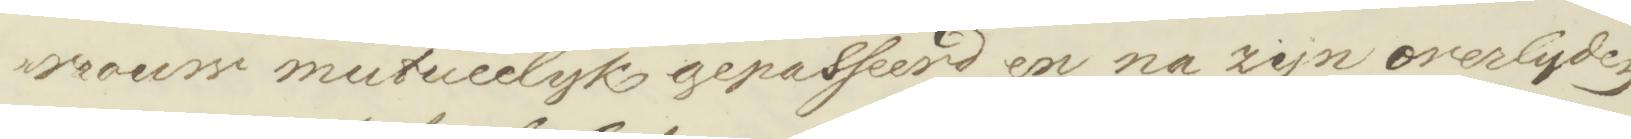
vrouw mutueelyk gepasseerd en na zijn overlijden
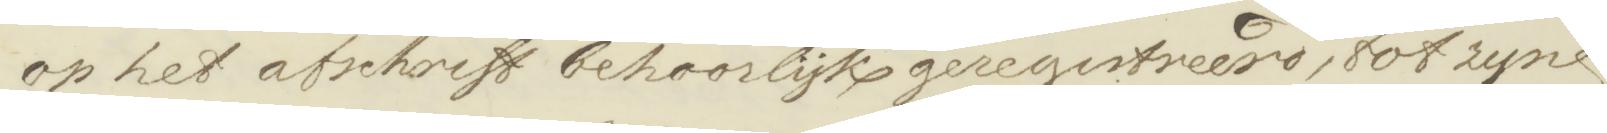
op het afschrift behoorlijk geregistreerd, tot zyne
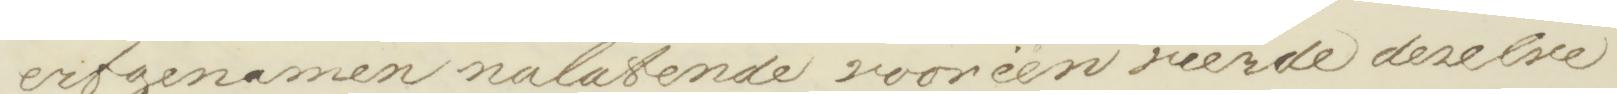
erfgenamen nalatende voor een vierde dezelve
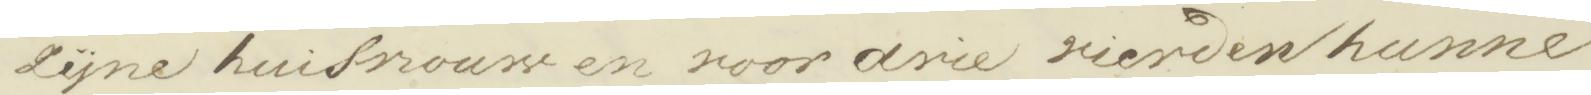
zijne huisvrouw en voor drie vierden hunne
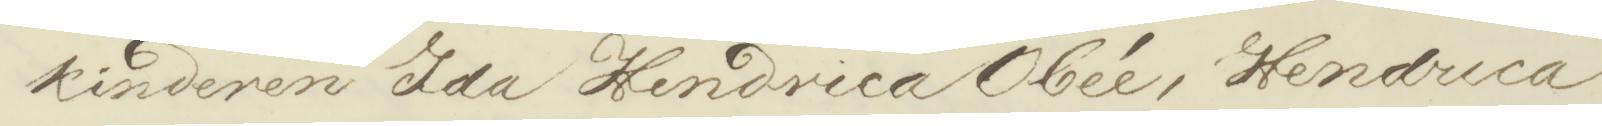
kinderen Ida Hendrica Obeé, Hendrica
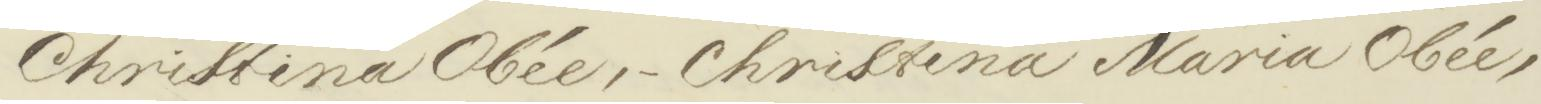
Christina Obée, - Christina Maria Obée,
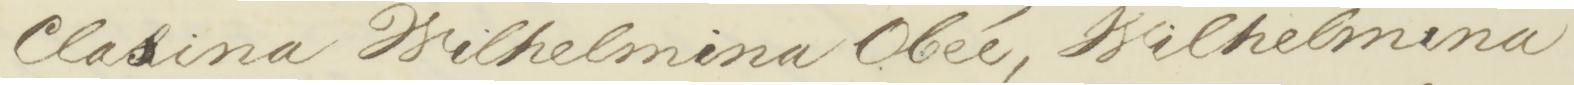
Clasina Wilhelmina Obeé, Wilhelmina
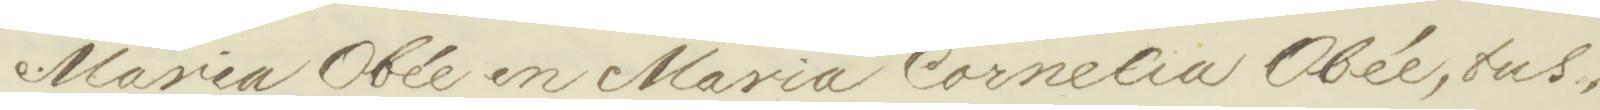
Maria Obée en Maria Cornelia Obée, tus
